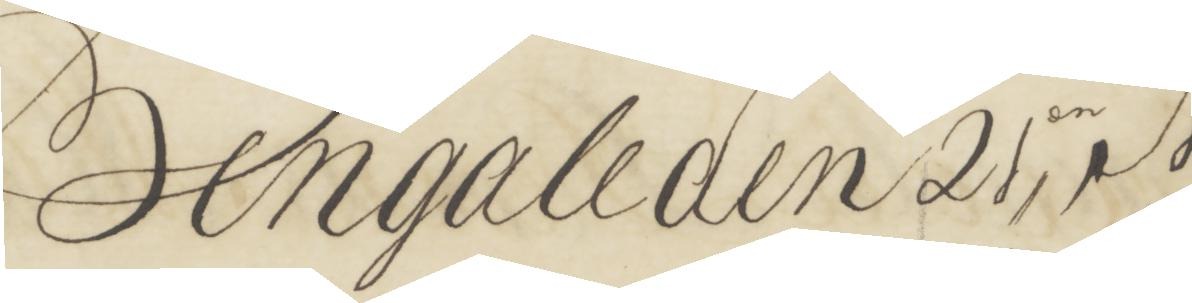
Van Bengale den 21„en Maart 1726
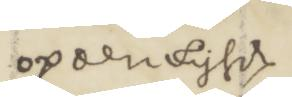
op den Eijseh
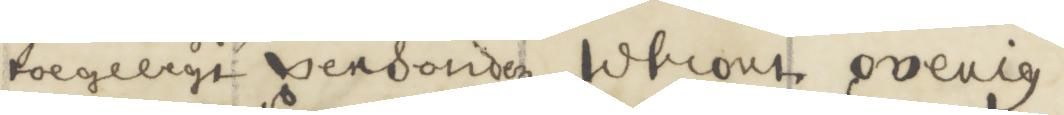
toegelegt versonden tekort overig
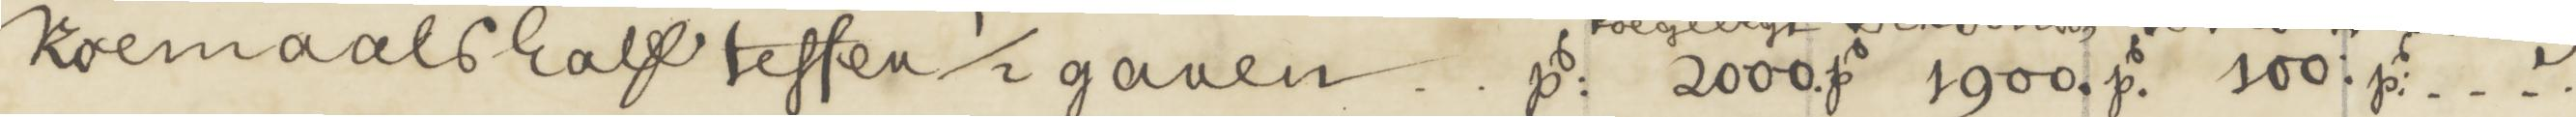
koemaals half tessen ½ garen . . p:s 2000.ps 1900. p.s 100: p:s - - -.
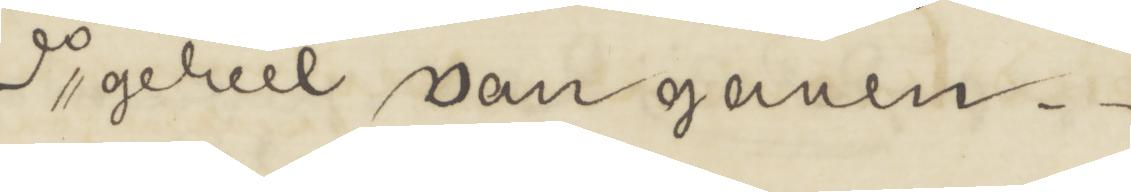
_„o geheel van garen - -
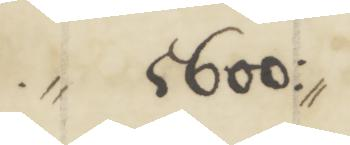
. „ 5600: „
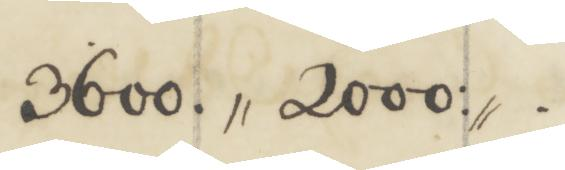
3600. „ 2000:„ .
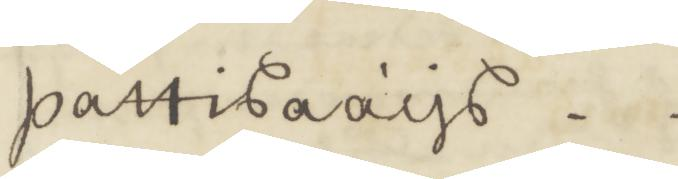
pattisaaijs -
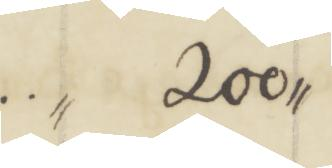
. „ 200„
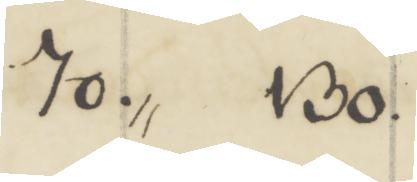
70.„ 130.
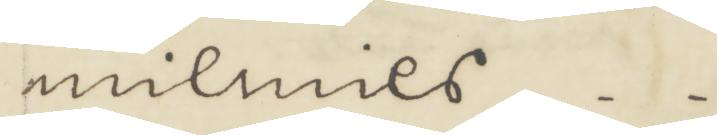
milmies - - -
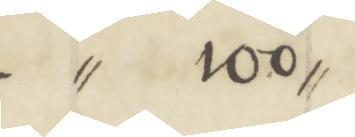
„ 100„
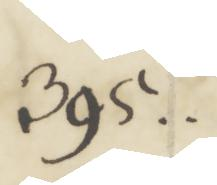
395. .
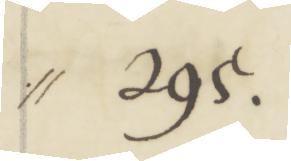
„ 295.
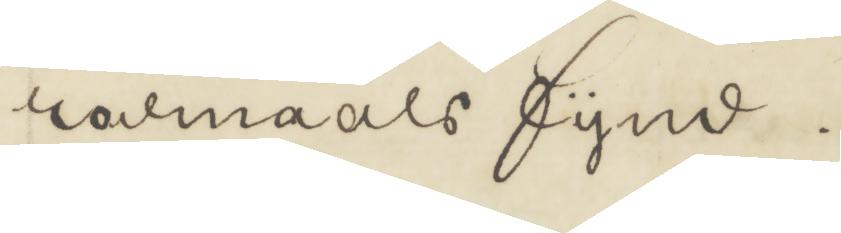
roemaals fijne
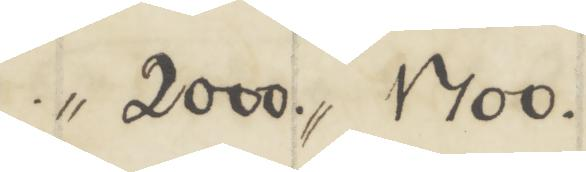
. „ 2000.„ 1700.
